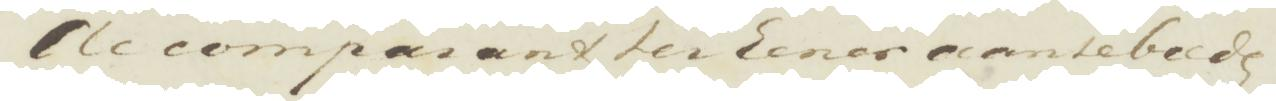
de comparant ter Eener aan te bieden
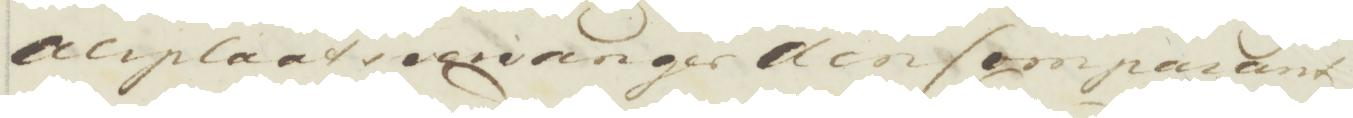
als plaatsvervanger den Comparant
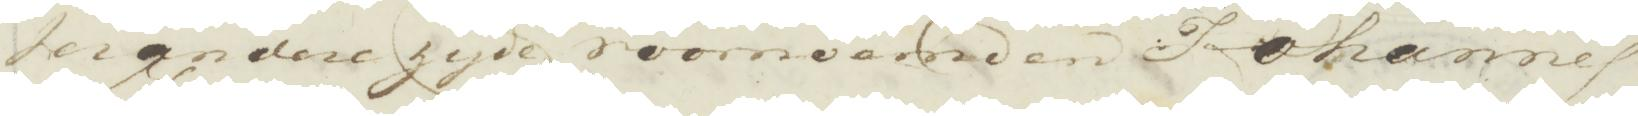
ter andere zyde voornoemden Iohannes
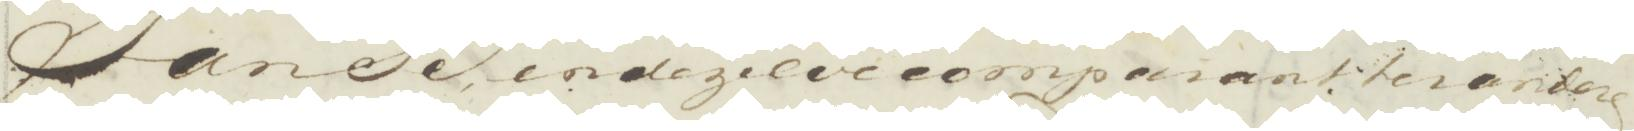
Ianse, en dezelve comparant ter andere
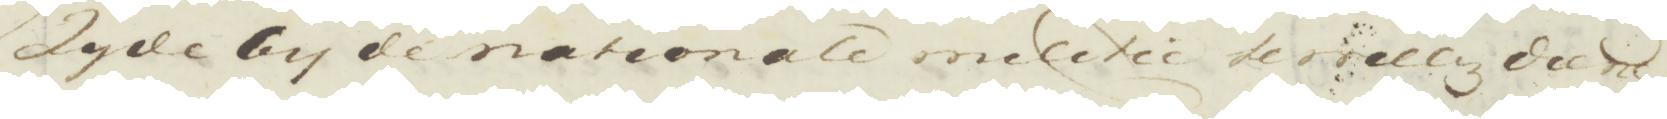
zyde by de nationale militie te willen dienen
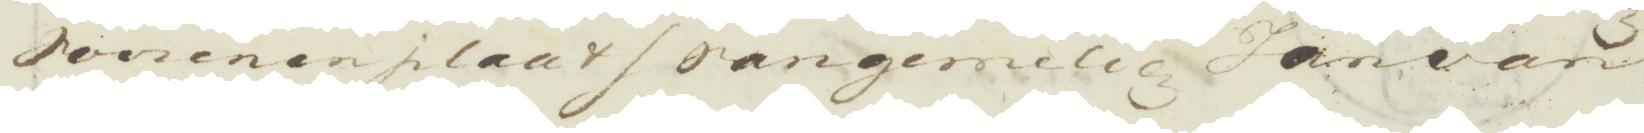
voor en in plaats van gemelden Ian van
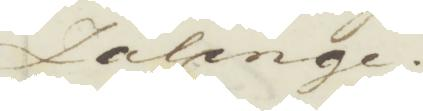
Zalinge.
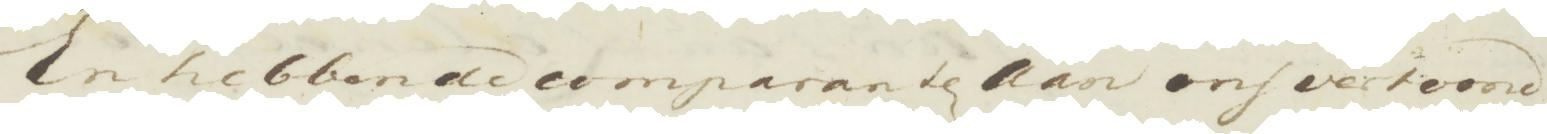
En hebben de comparante aan ons vertoond
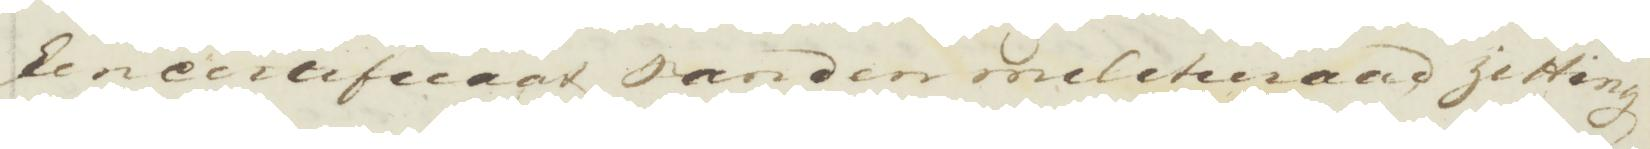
Een certificaat van den militieraad zitting
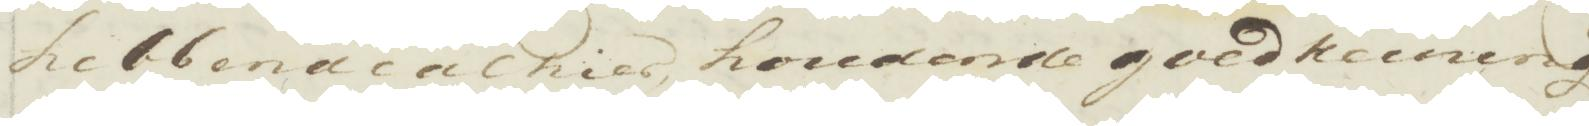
hebbende alhier, houdende goedkeuring
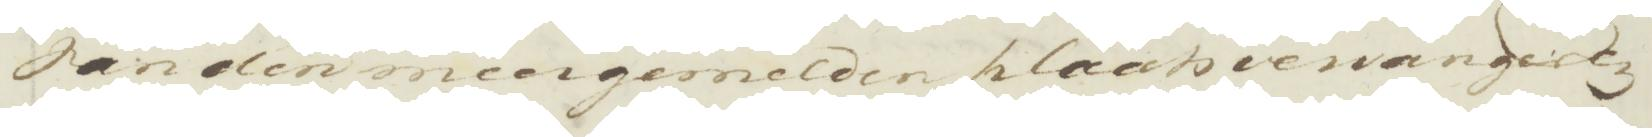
van den meergemelden plaatsvervanger en
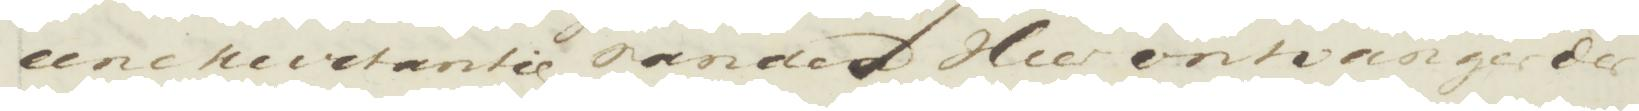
eene revetantie van den Heer ontvanger der
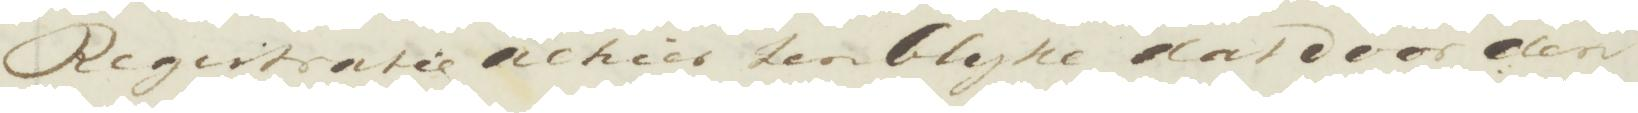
Registratie alhier ten blyke dat door den
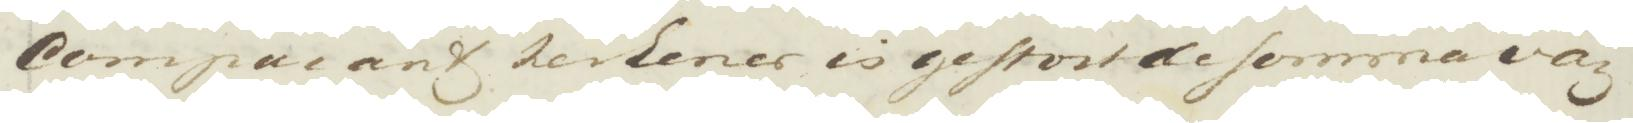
comparant ter Eener is gestort de somma van
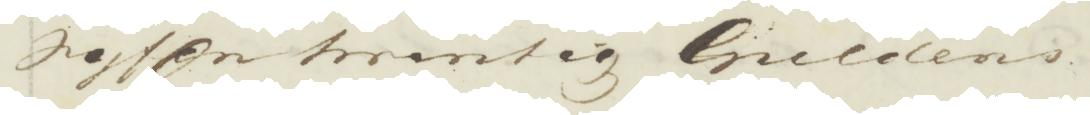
vyf en twintig Guldens.
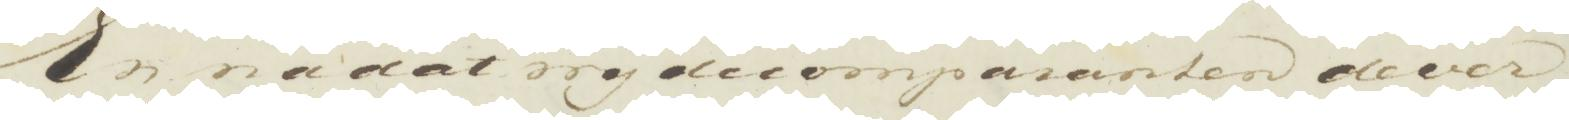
En nadat wy de comparanten de ver
